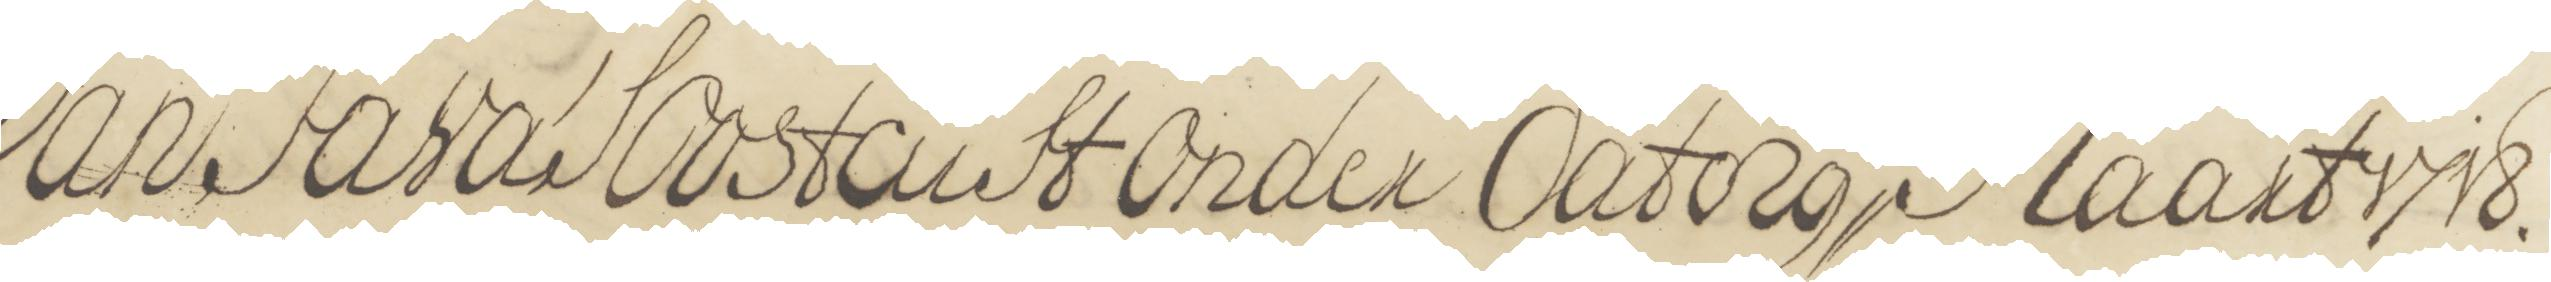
Van Java's Oostcust Onder dato 29„en Maart 1718.
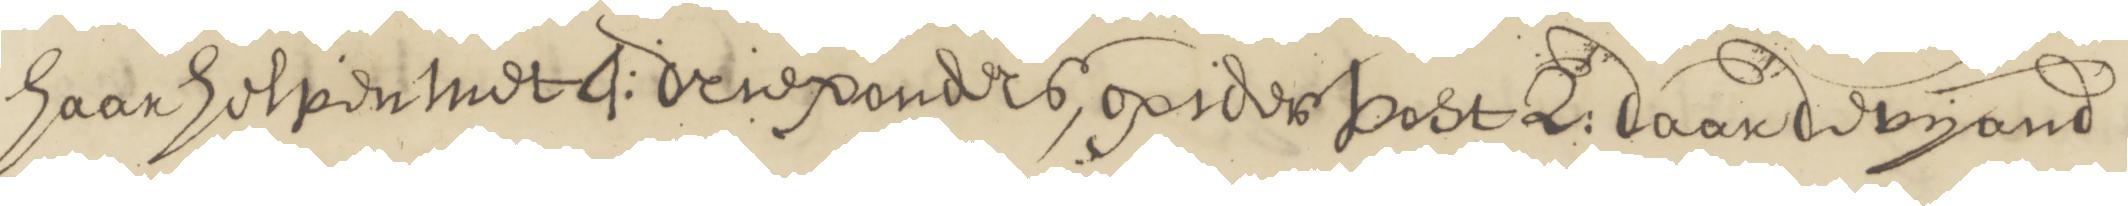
haar helpen met 4: drieponders, op ider post 2: daar de vijand
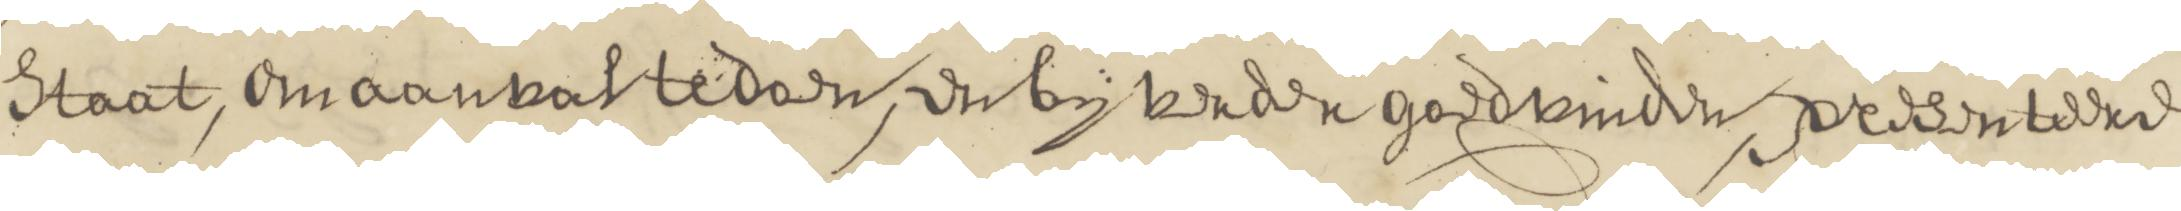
staat, om aanval te doen, en bij verder goedvinden, presenteere
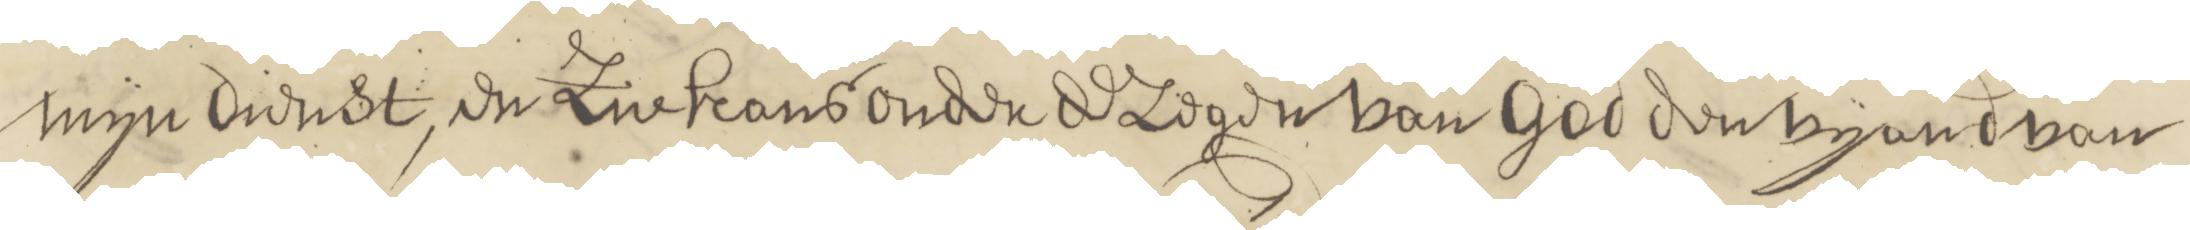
mijn dienst, en Zie kans onder de Zegen van God den vijand van
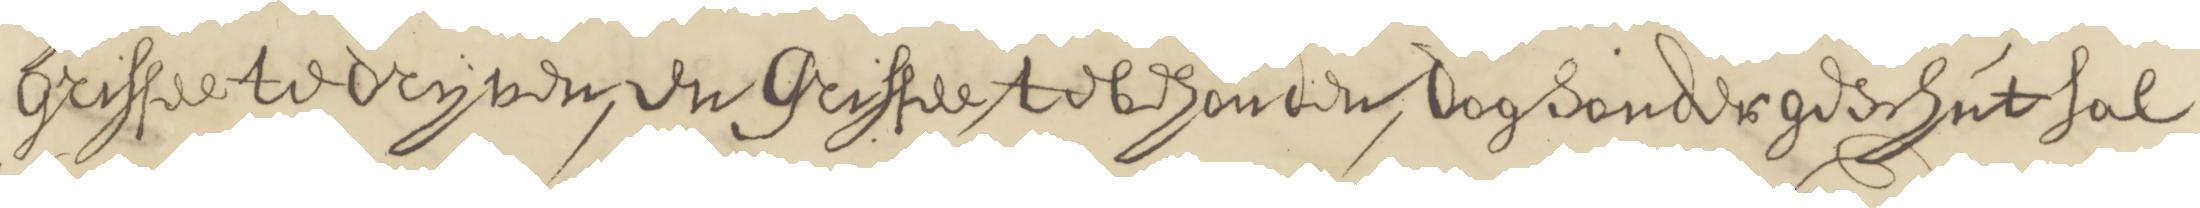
grissee te drijven, en Grissee te behouden, dog sonder geschut Sal
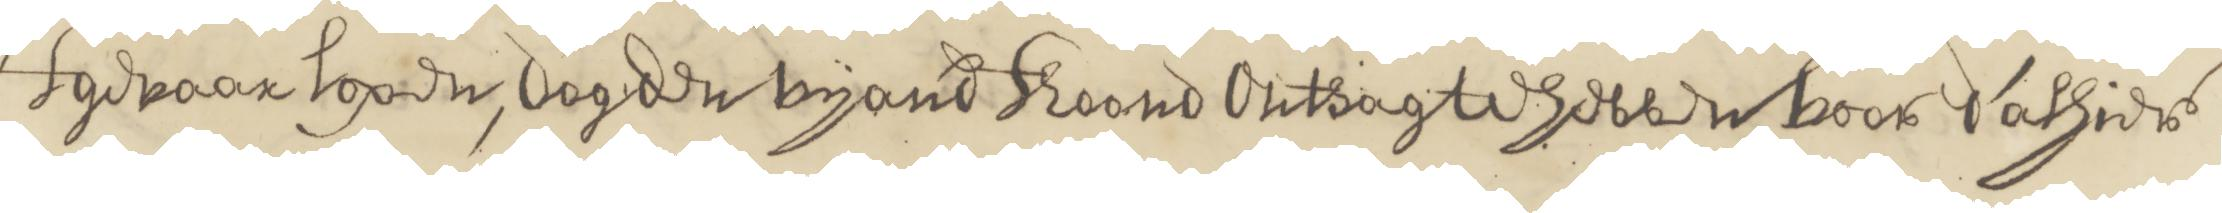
't gevaar lopen, dog den vijand thoond Ontsag te hebben voor d'alhier
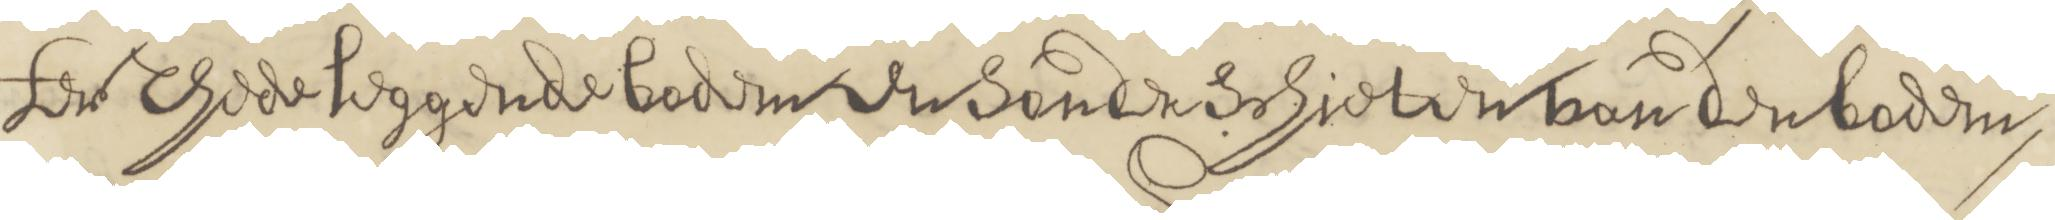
ter rhede leggende bodem en Sonder Schieten van den bodem,
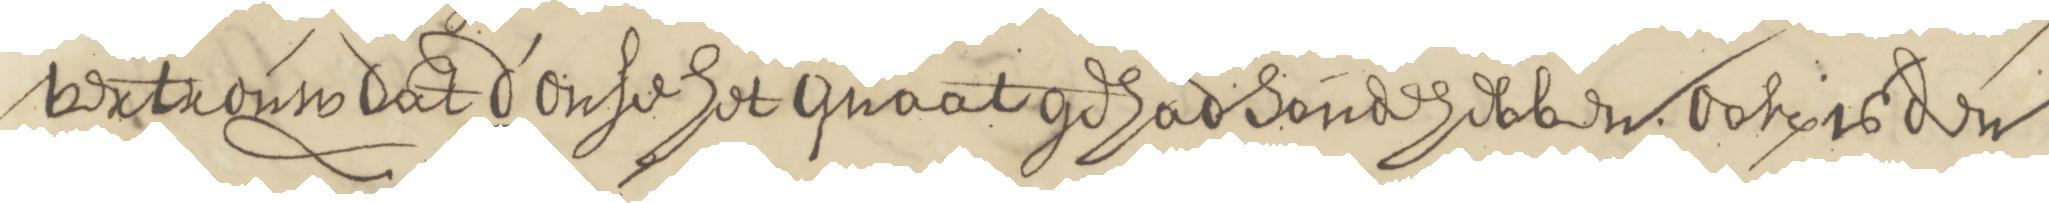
vertrouw dat d’ onse het quaat gehad Soude hebben. Ook is den
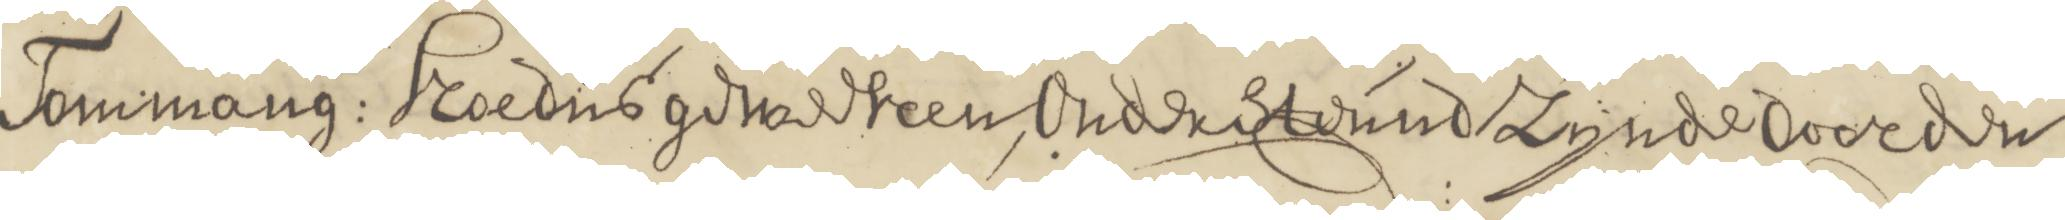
Tommang:' koedus geweeken, ondersteund Zijnde door den
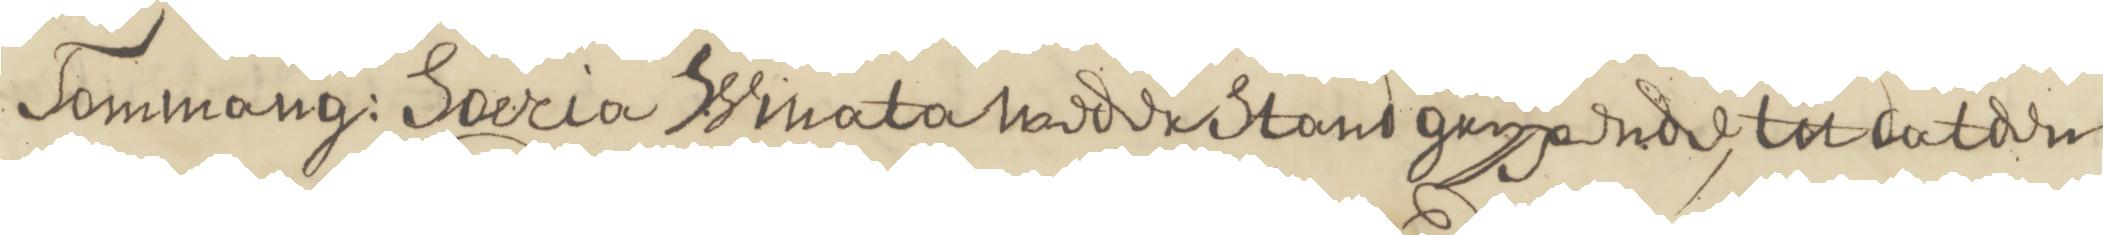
Tommang:' Soeria Winata weder stand grijpende, tot dat den
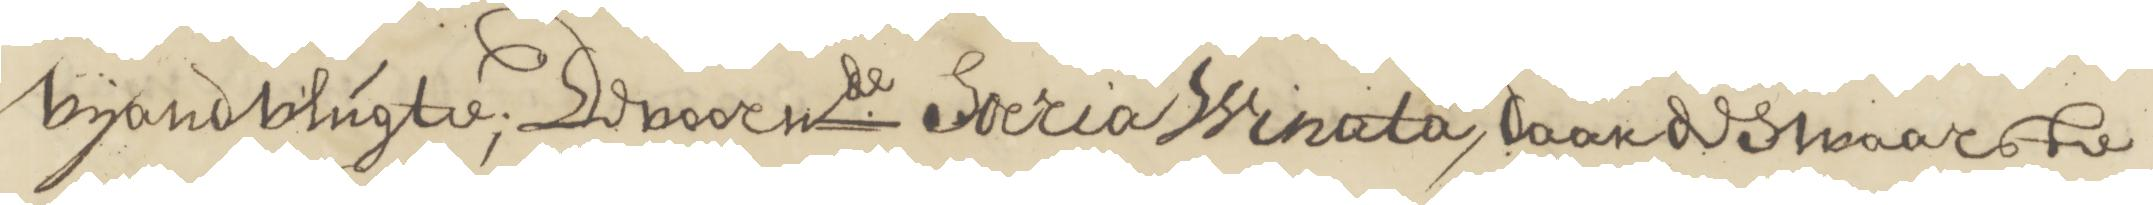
vijand vlugte; De voorn=de Soeria Winata, daar de swaarste
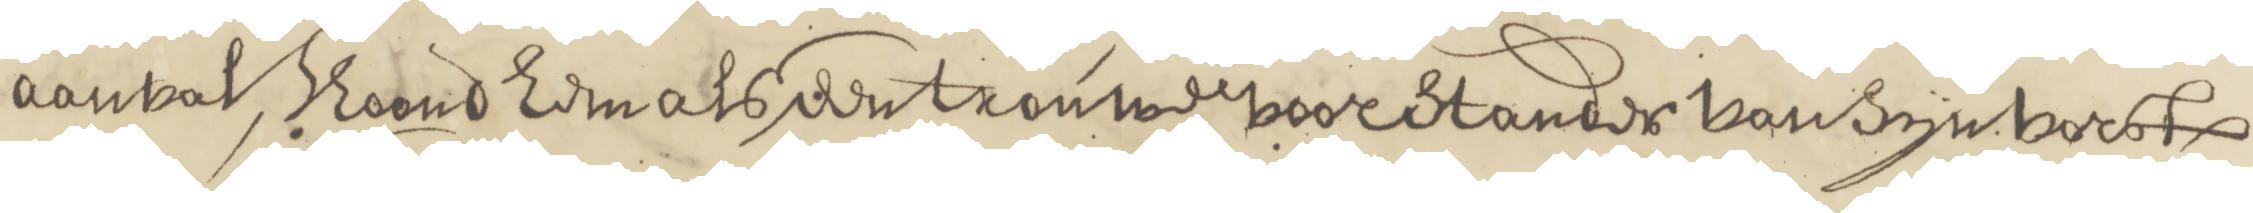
aanval, thoond hem als een trouwe voorstander van sijn vorst
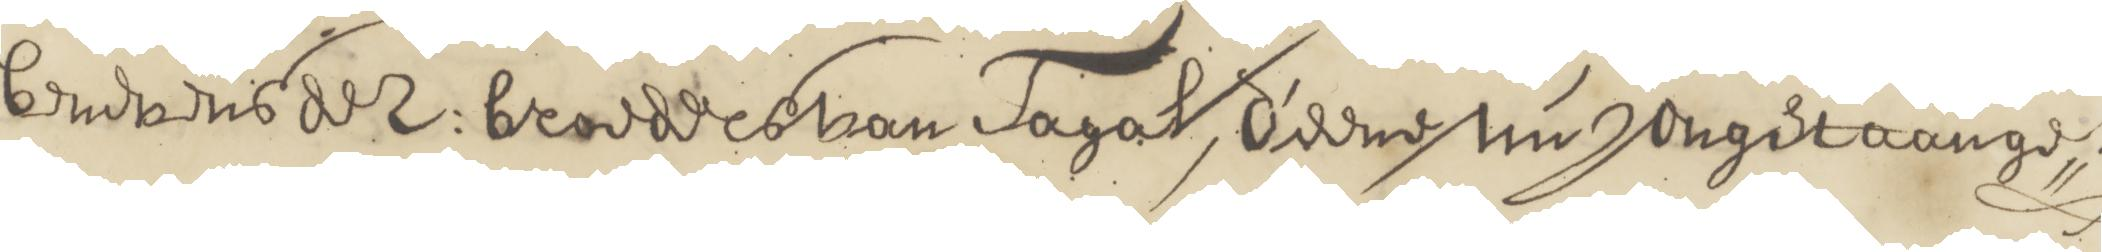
benevens de 2: broeders van Tagal, d'eene nu jongst aange„
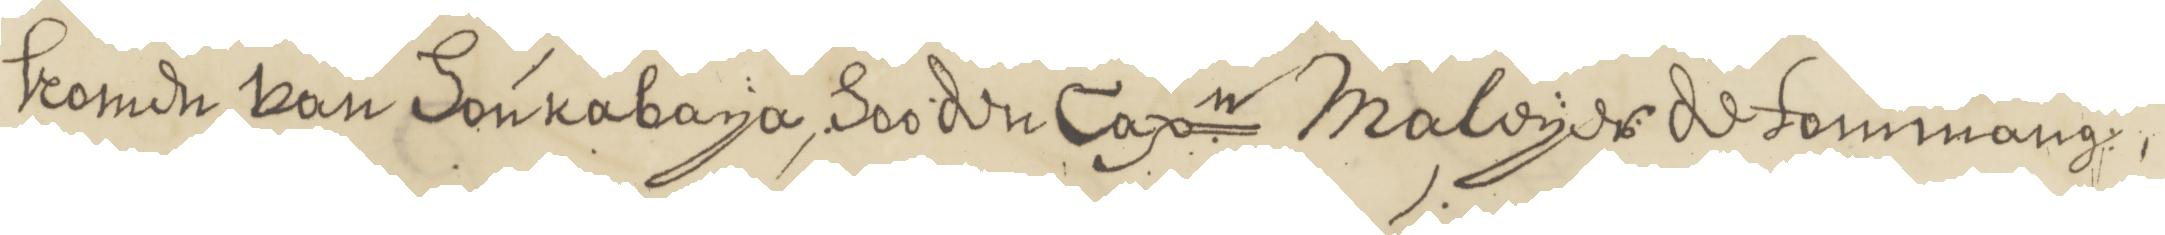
komen, van Sourabaija, Soo den Cap=n Maleijer de tommang:',
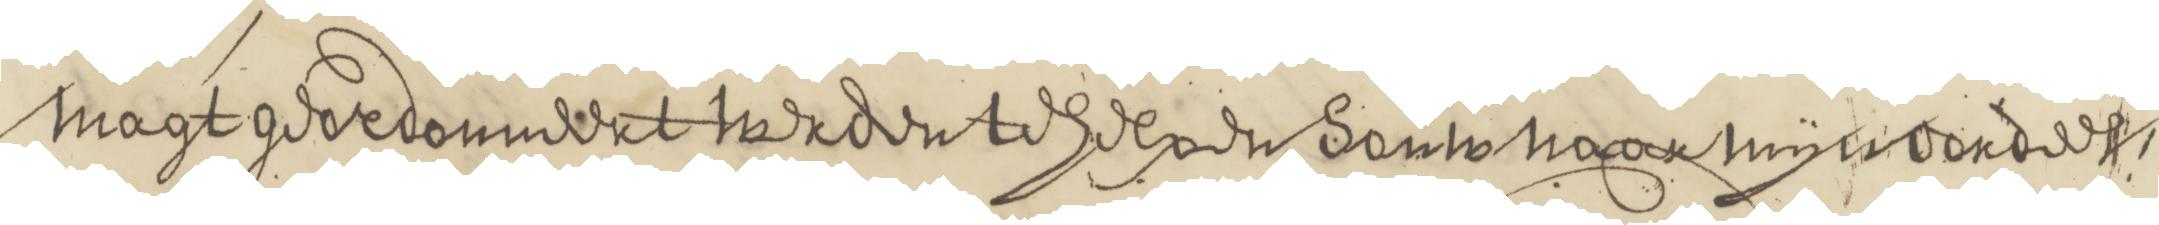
magt geordonneert werden te helpen, souw naar mijn oordeel,
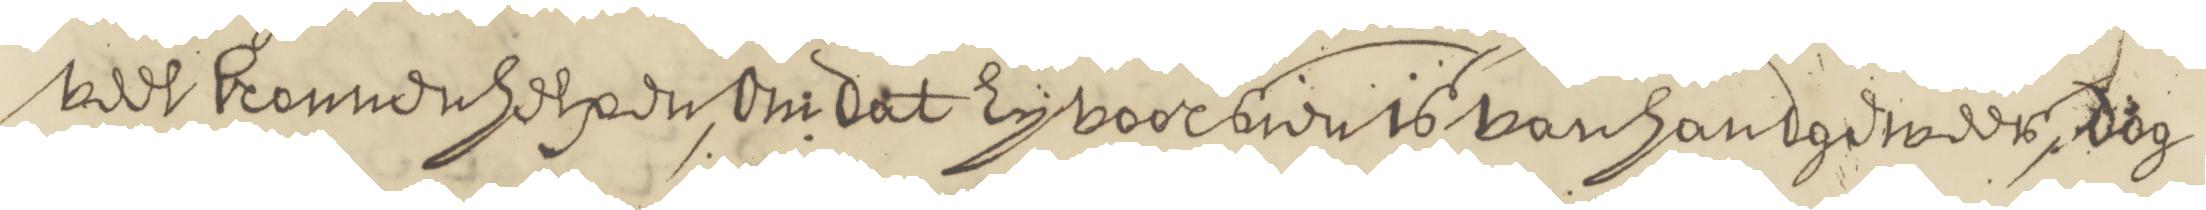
veel konnen helpen, om dat hij voorsien is van handgeweer, dog
